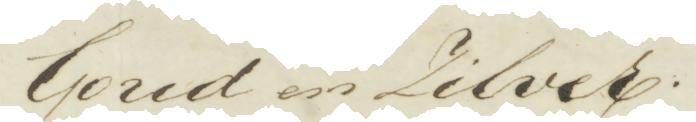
Goud en Zilver.
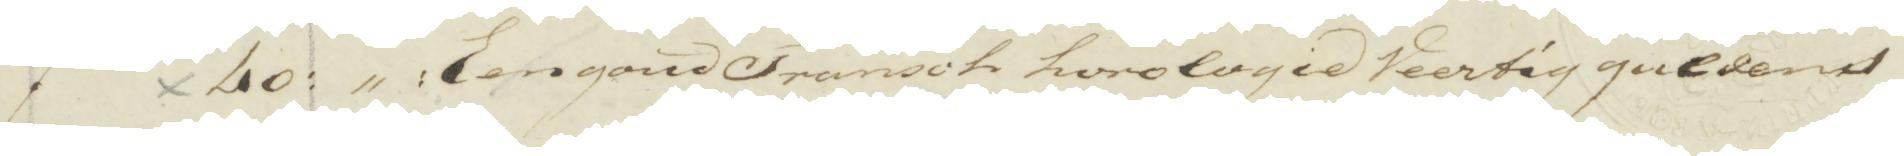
ƒ x 40: „: Een goud Fransch horologie Veertig guldens
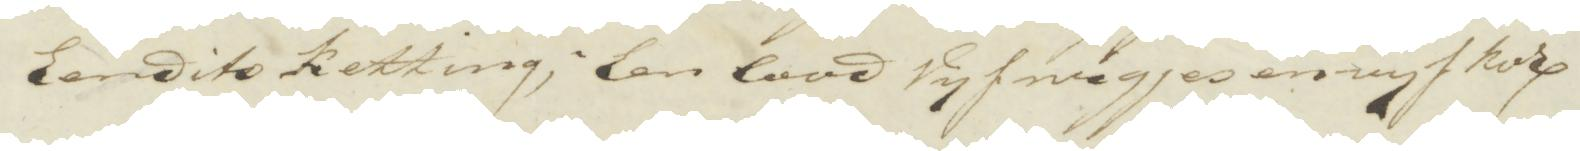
Een dito ketting, Een lood vyf wigjes en vyf kor
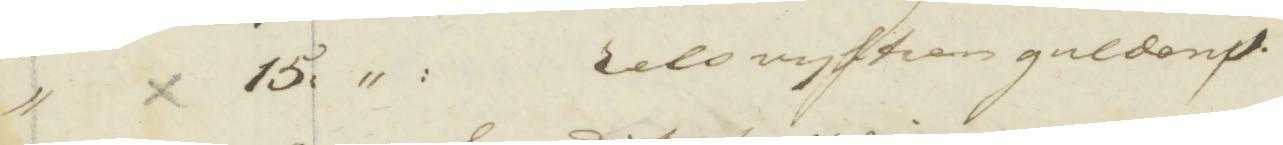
„ x 15: „: rels vyftien guldens.
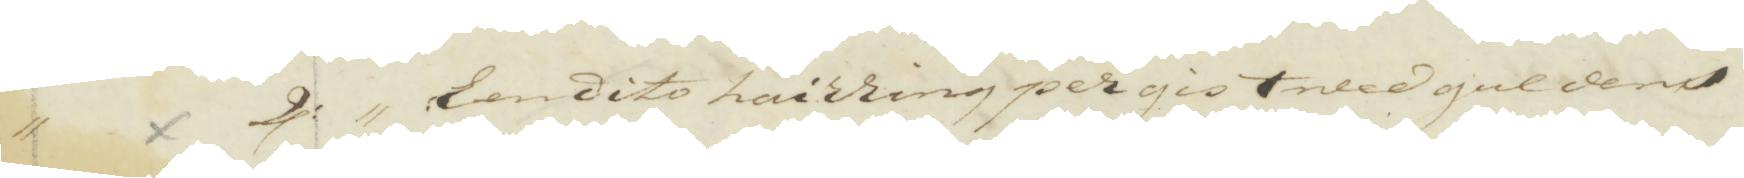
„ x 2: „ Een dito hairring per gis twee guldens
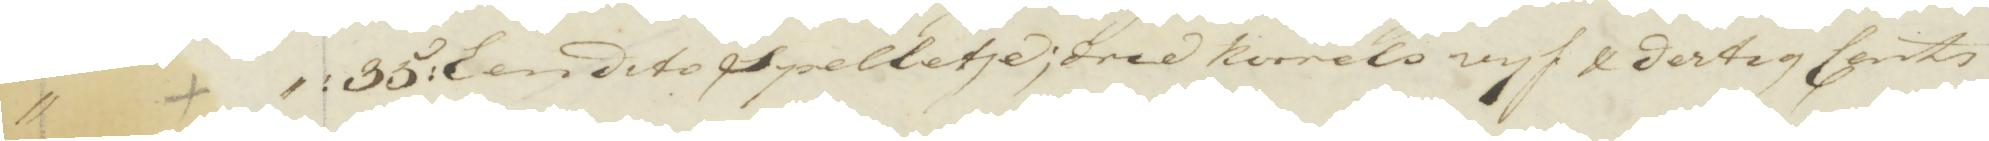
„ x „: 35: Een dito spelletje; drie korrels vyf & dertig Cents
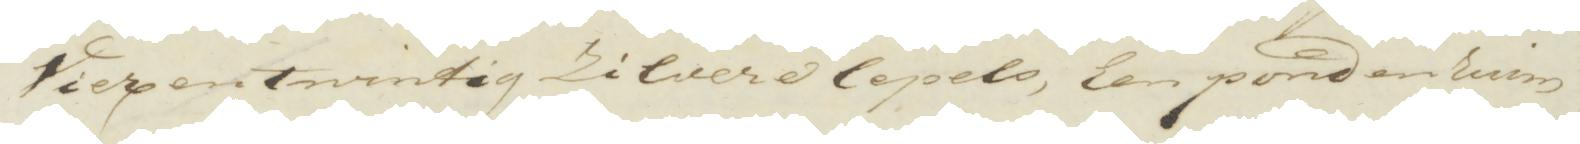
Vier entwintig zilvere lepels, Een pond en ruim
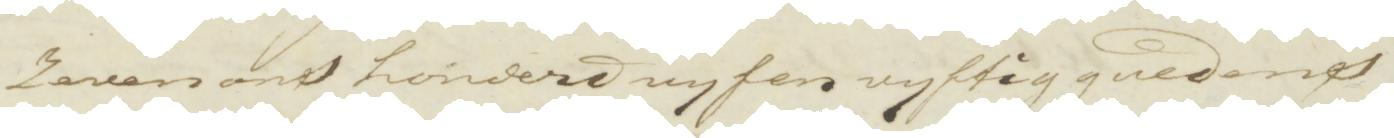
zeven ons honderd vyfen vyftig guldens
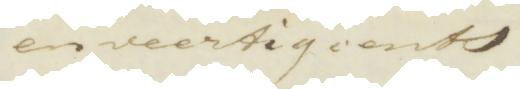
en veertig cents
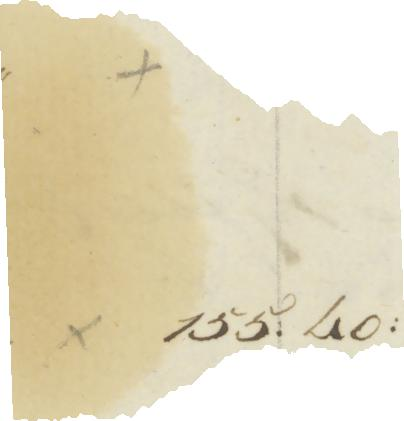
„ x 155: 40:
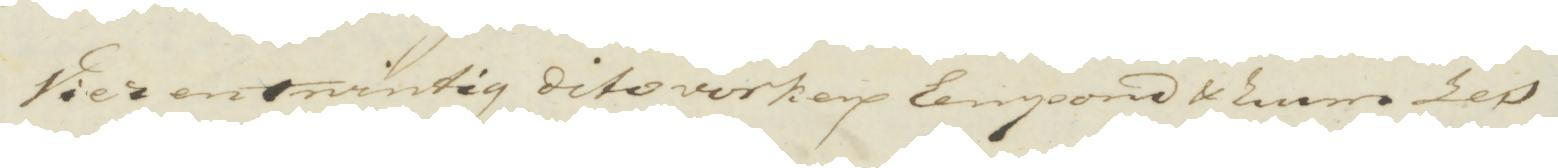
Vier en twintig dito vorken Een pond & ruim zes
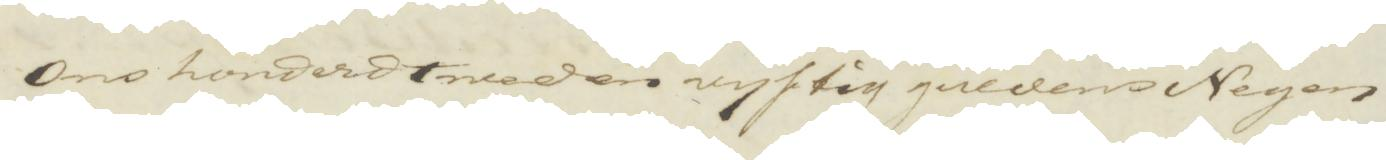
ons honderd twee en vyftig guldens Negen
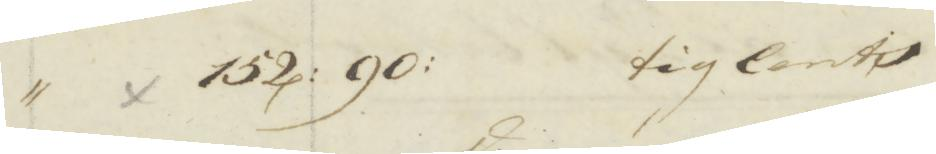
„ x 152: 90: tig Cents
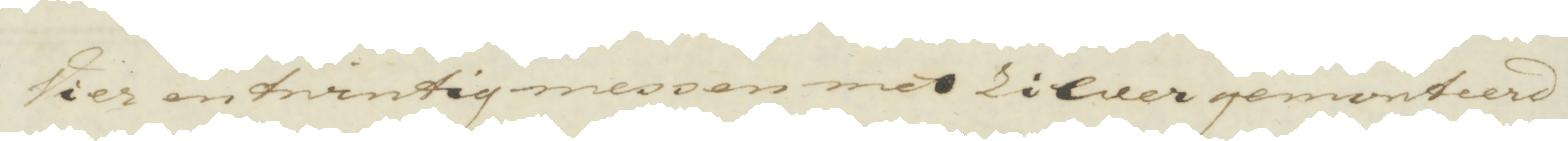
Vier en twintig messen met zilver gemonteerd
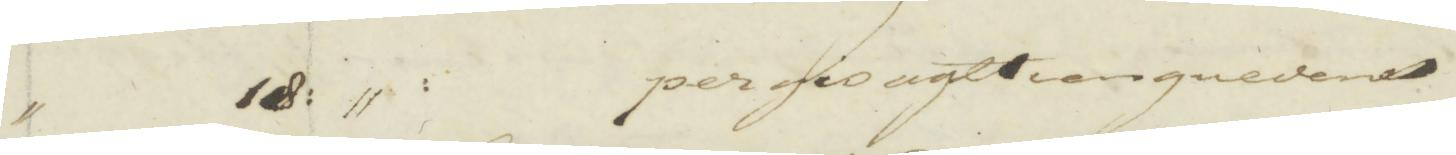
„ 18: „: per gis agtien guldens
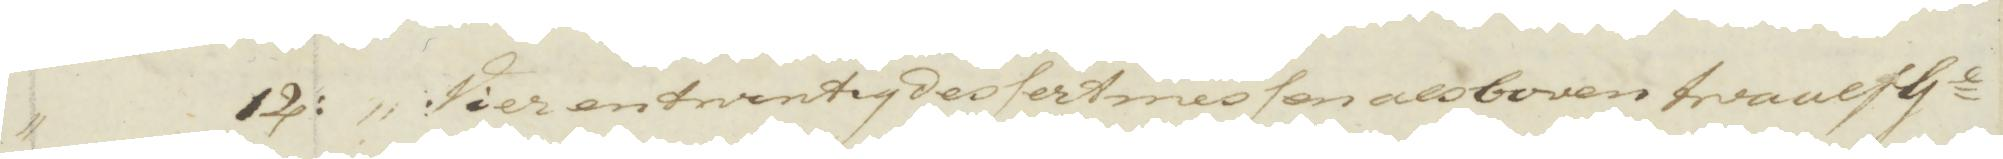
„ 12: „ Vier en twintig dessert messen als boven twaalf g=l
